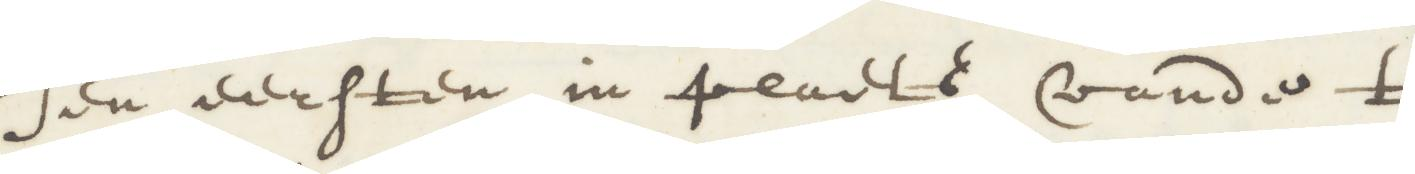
Ten eersten in plaets van de t
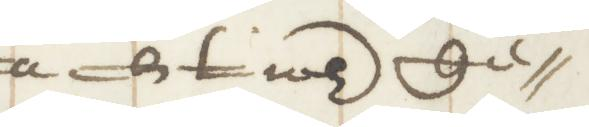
achtich ge„
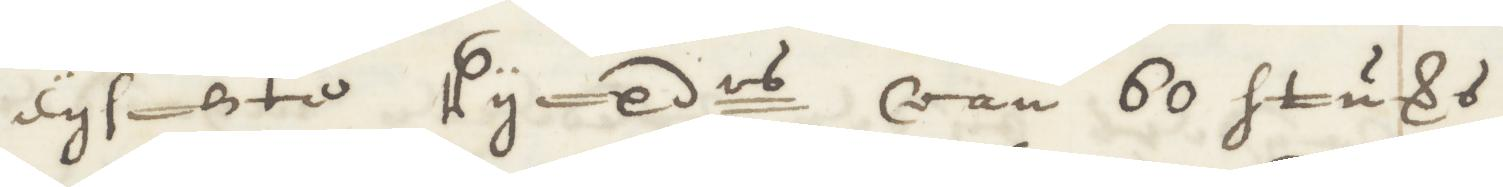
eijschte Rijcxd=rs van 60 stuvers
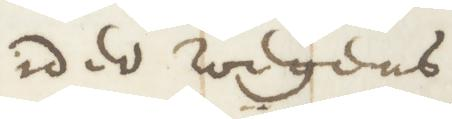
ider wegens
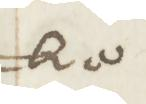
ke
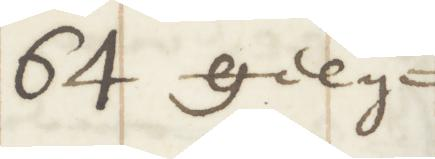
64 gelijc
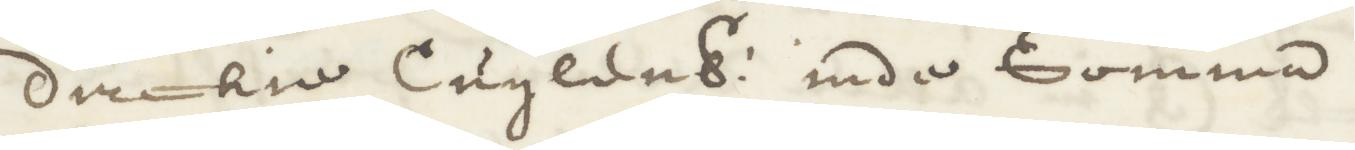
dirckie Cuylens: inde somma
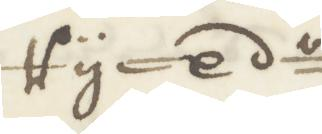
Rijcxd=
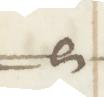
ch
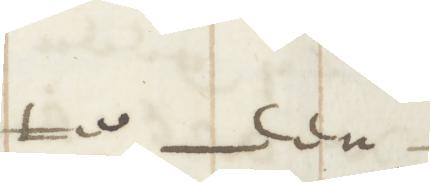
te eEen
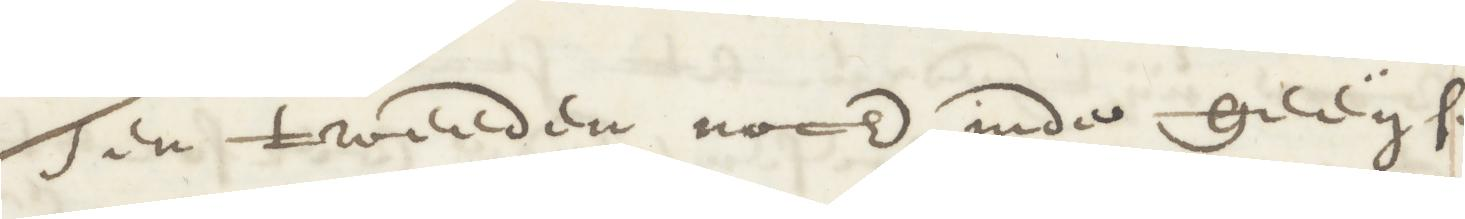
Ten tweeden noch inde geeijs
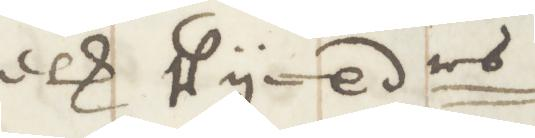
elver Rijcxd=rs
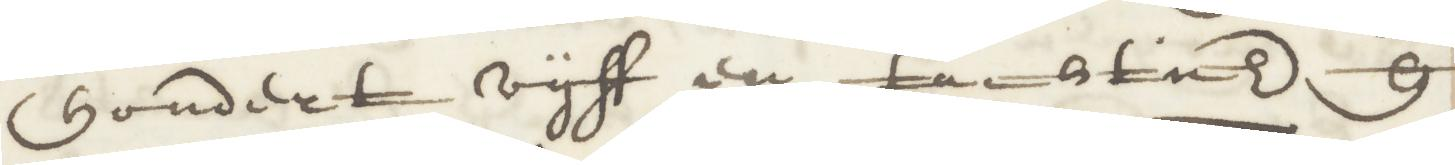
hondert vijff en tachtich g
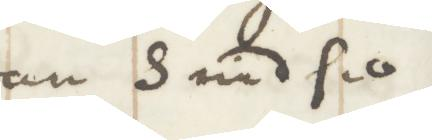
an smidse
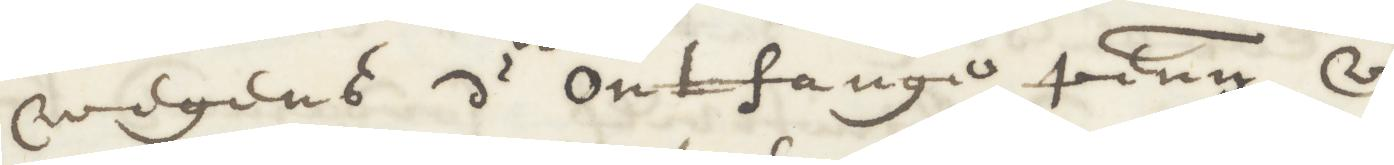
wegens d’ ontfange penn v
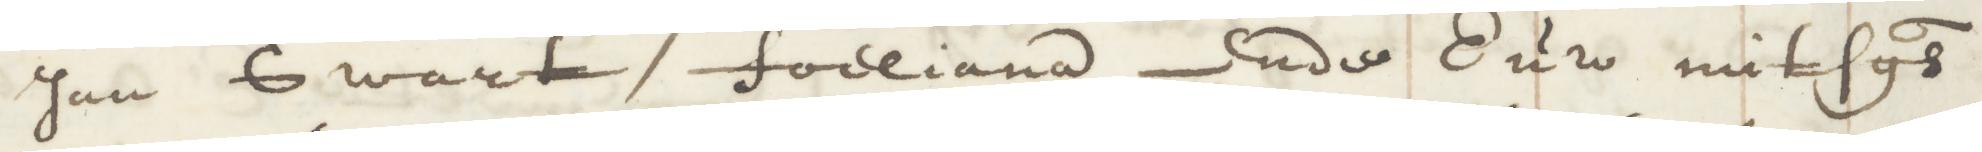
Jan Ewart, foeliana ende E uw mitsgs
